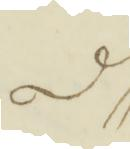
do„
